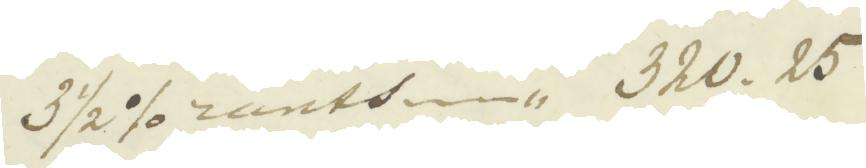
3½% rents . . . . „ 320. 25
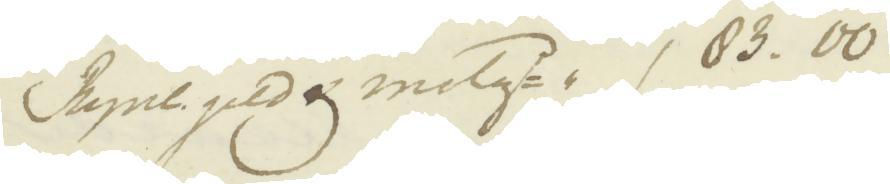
Rijx. geld en mitg=d „ 83.00
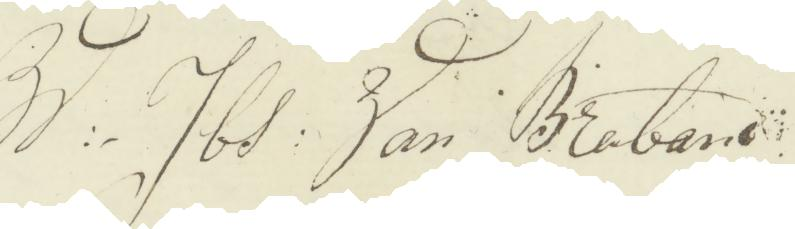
W: Jbs: Van Braband
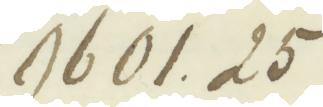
ƒ 9601. 25
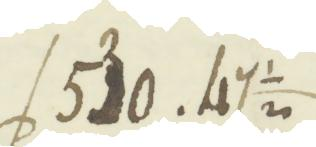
ƒ 530. 47½
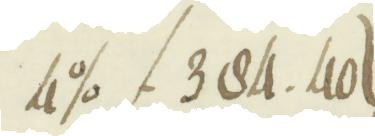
4% ƒ 384. 40
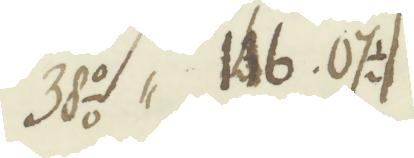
38% „ 146. 07½
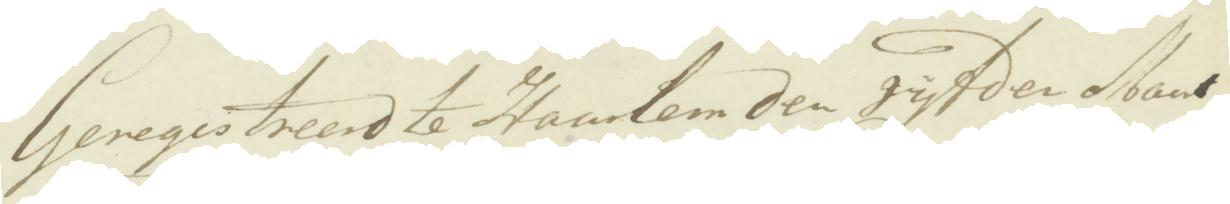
Geregistreerd te Haarlem den Vijfder staat
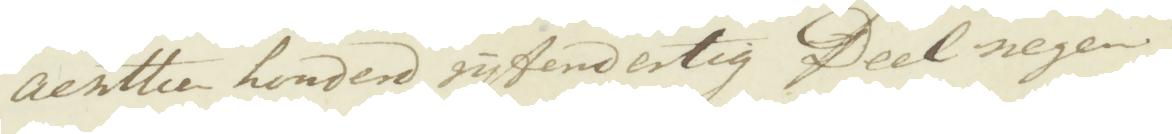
achttien honderd vyfendertig Deel negen
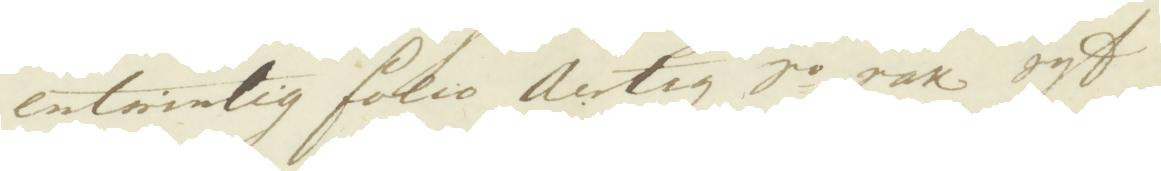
en twintig folio dertig Vo vak vyf
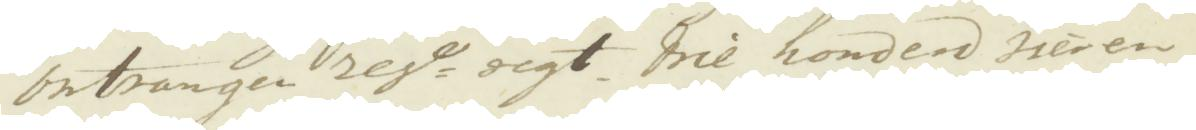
ontvangen res=e regt drie honderd vier en
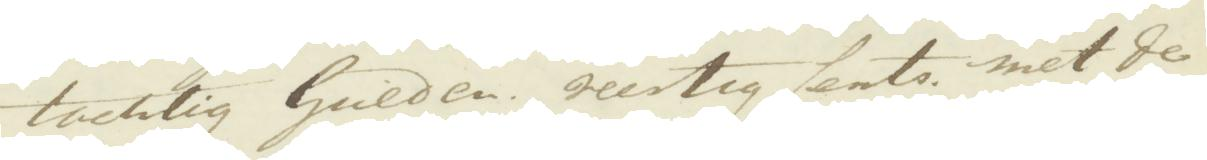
tachtig Gulden. veertig Cents met de
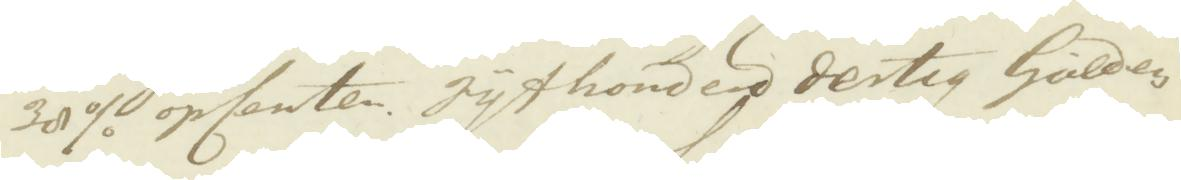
3871 op Centen. vijf honderd dertig Gulden
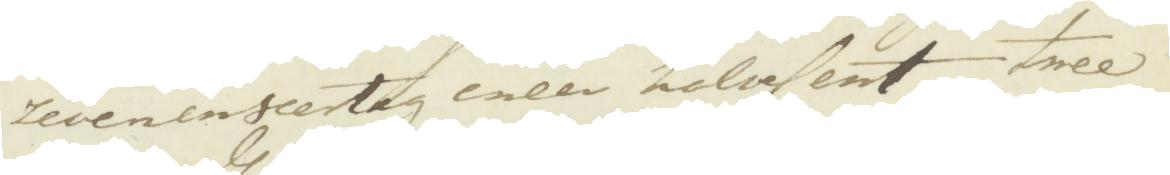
zeven en veertig en een halve Cent. twee
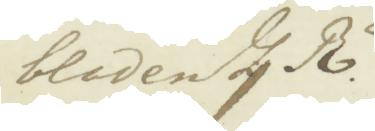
bladen Z R.
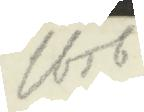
1656
